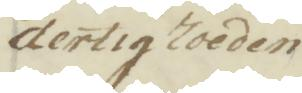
dertig roeden
